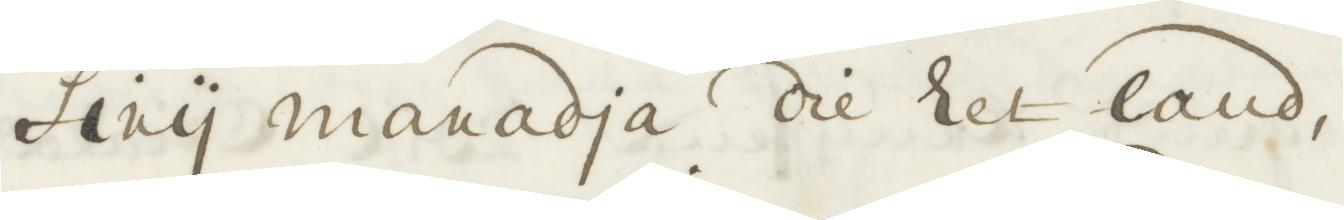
sirij maradja die het land,
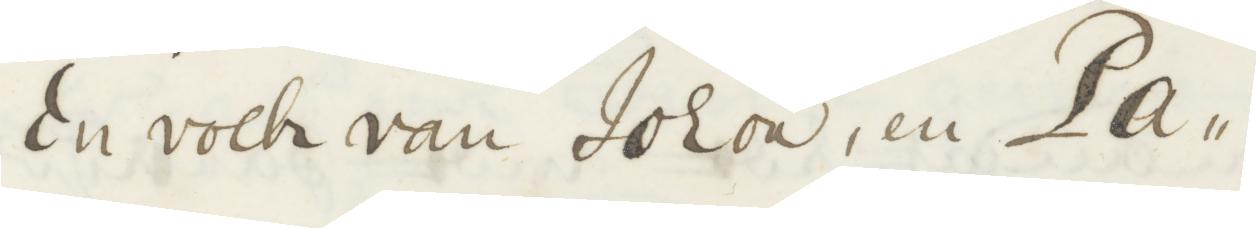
En volk van Johor, en Pa„
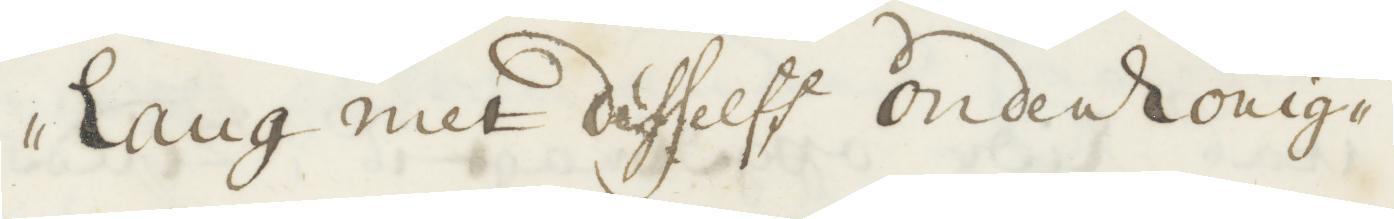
„hang met desselff onderhorig„
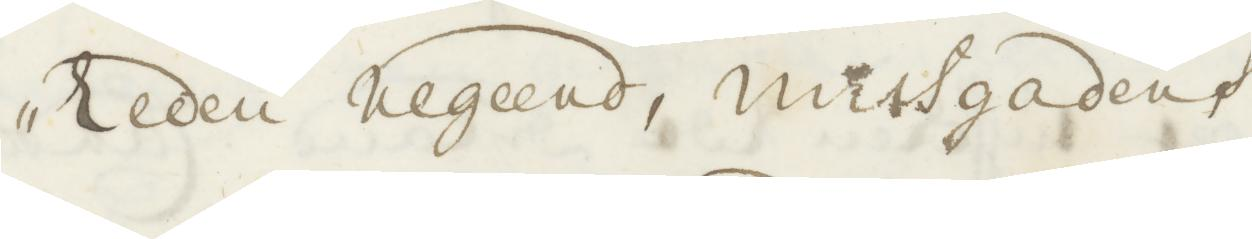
„heden regeerd, mitsgaders
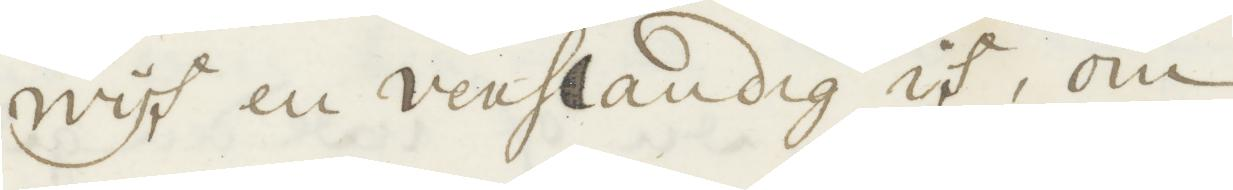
wijs en verstandig is, om
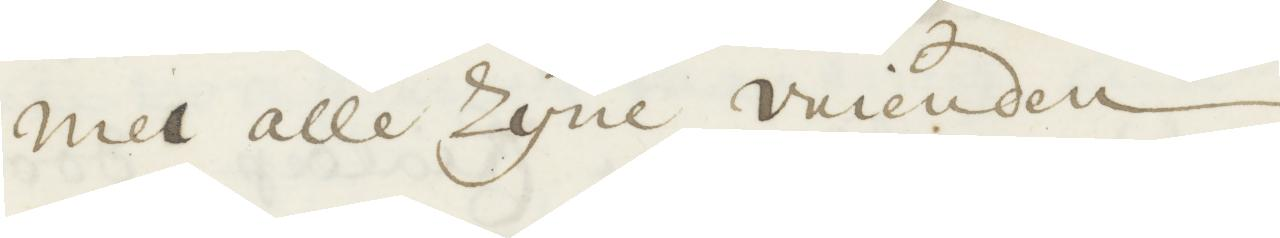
met alle zijne vrienden
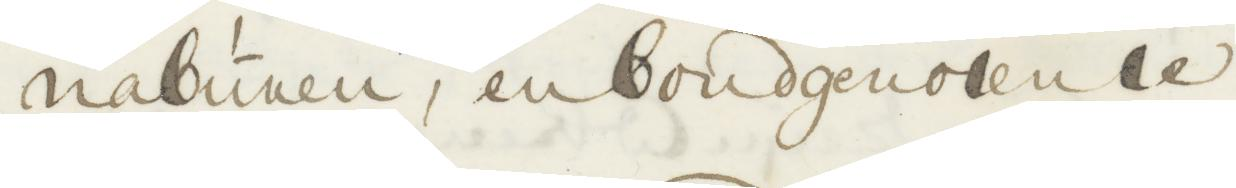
naburen, en bondgenoten te
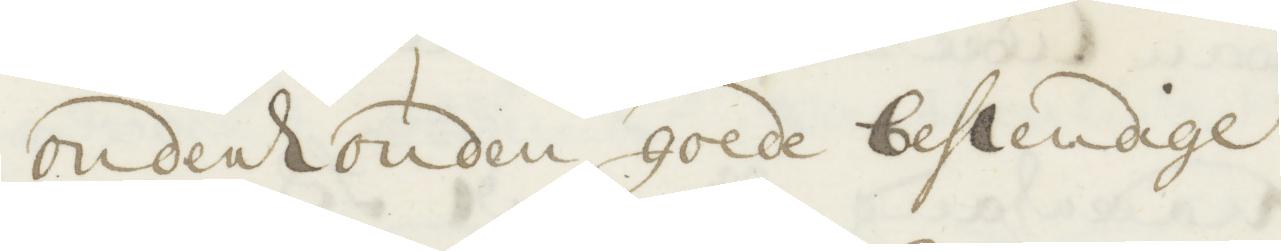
onderhouden goede bestendige
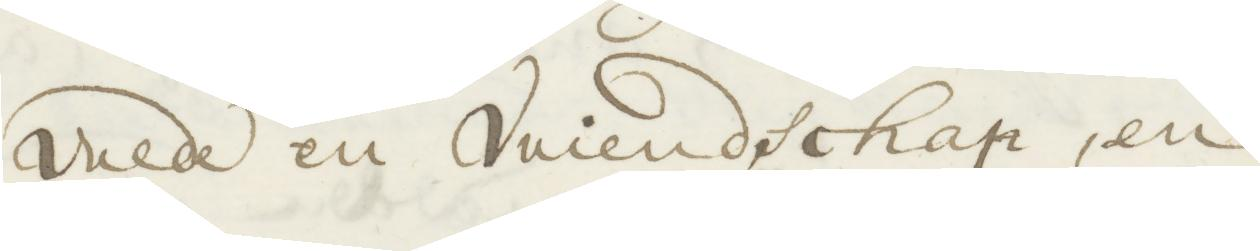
vrede en vriendschap, en
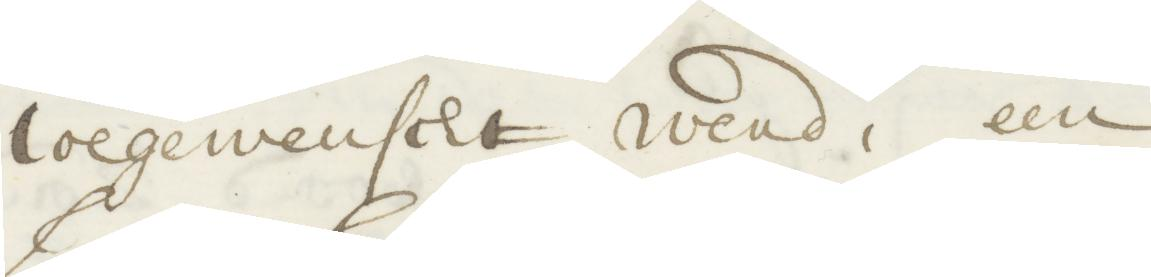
toegewenscht werd, een
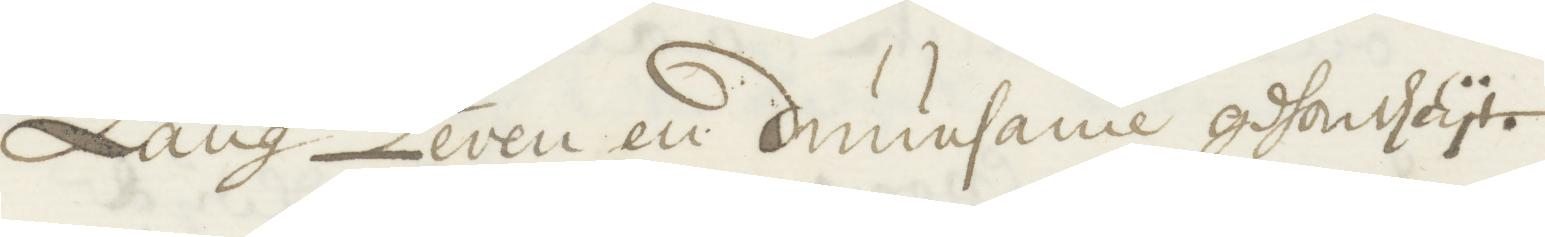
Lang Leven en duursame gesontheijt.
